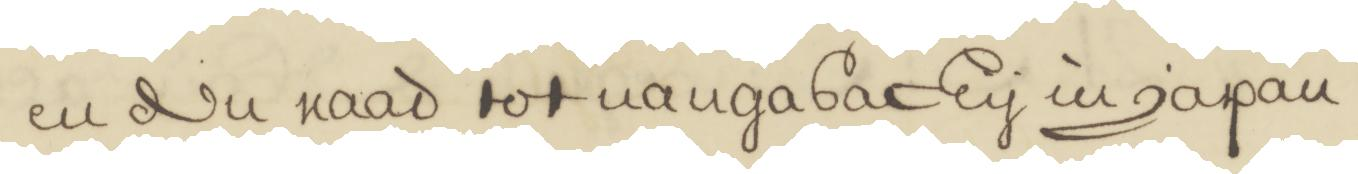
en den raad tot nangabachij in japan
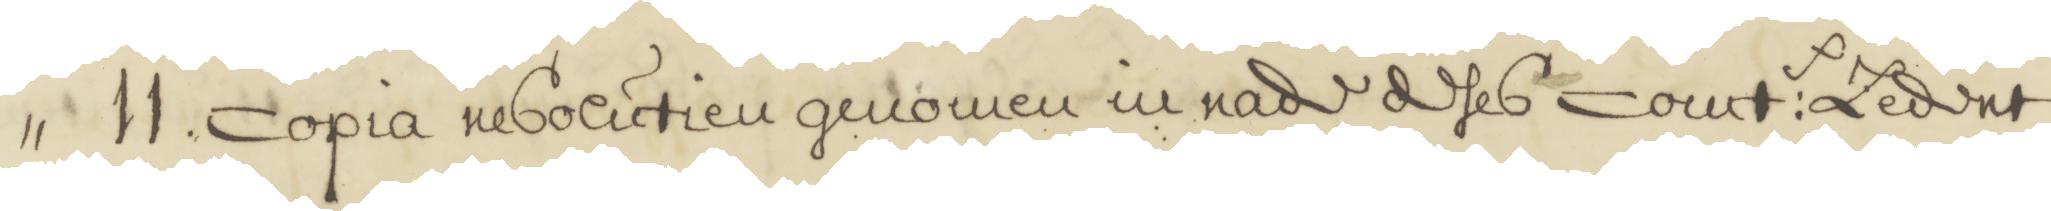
„ 11. Copia resolutien genomen in rade deses comt:s zedert
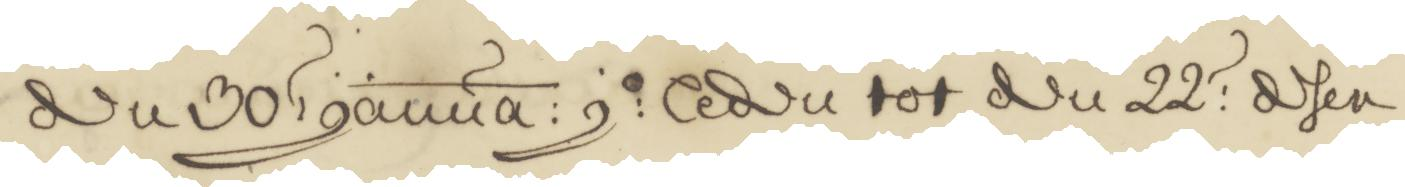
den 30.' janua: j:o leden tot den 22:' deser
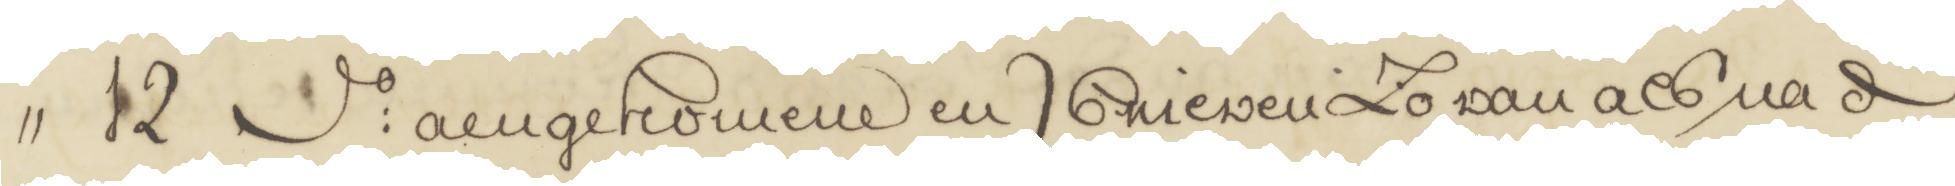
„ 12 D:o aengekomene en } brieven zo van als na de
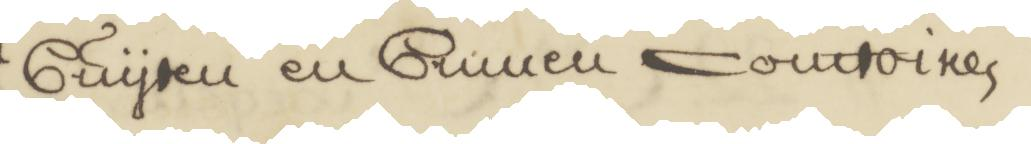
buijten en binnen comtoiren
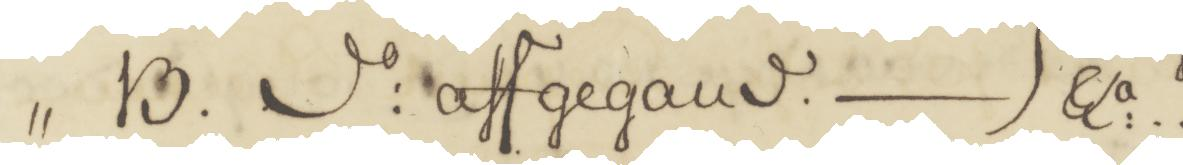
„ 13. D:o affgegane. — } &:a.
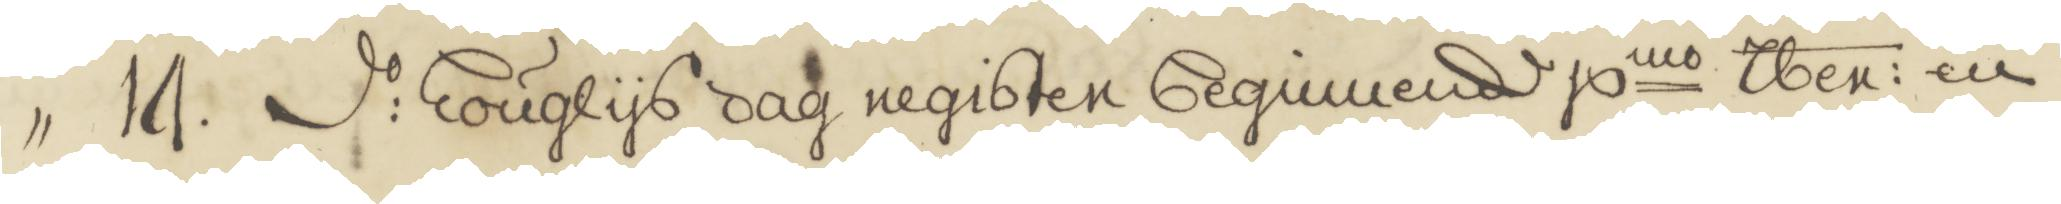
„ 14: D:o houglijs dag register beginnende p=mo 7ber: en
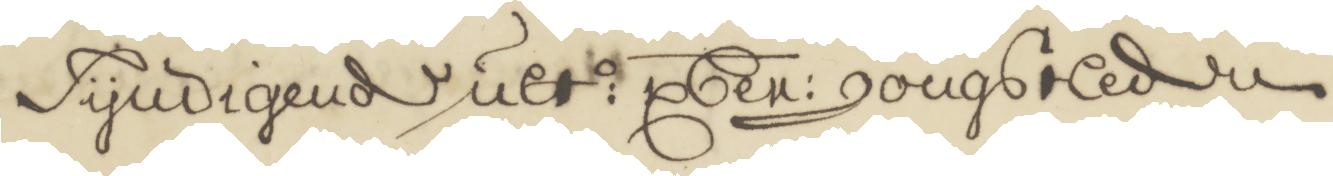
Eijndigende ult:o xber: jongstleden
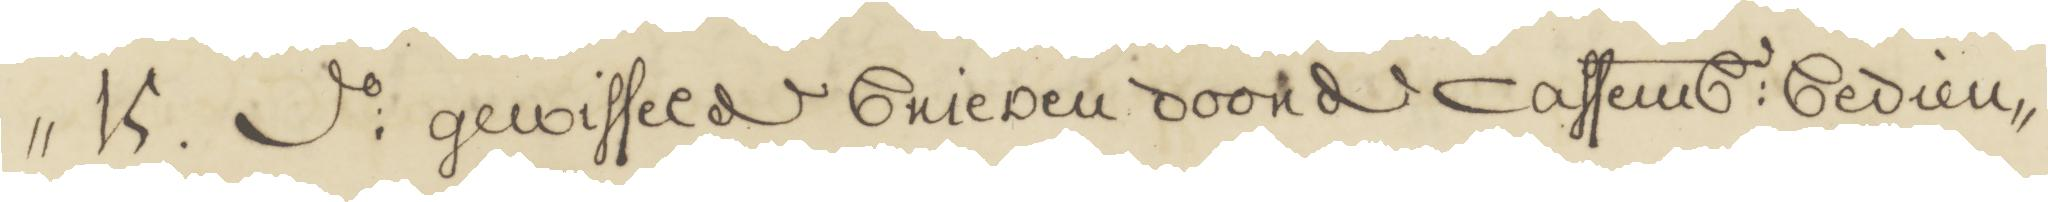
„ 15. D:o gewisselde brieven door de cassemb:e bedien„
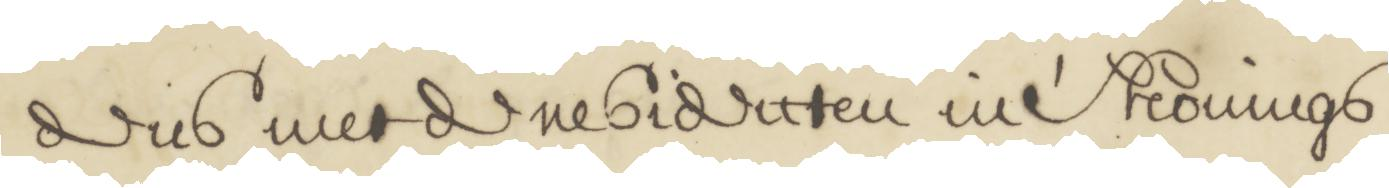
dens met de residenten in 's konings
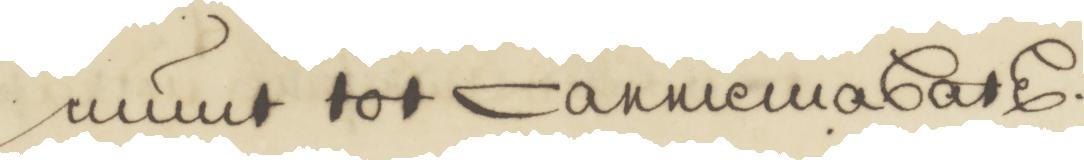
munt tot Carriemabath
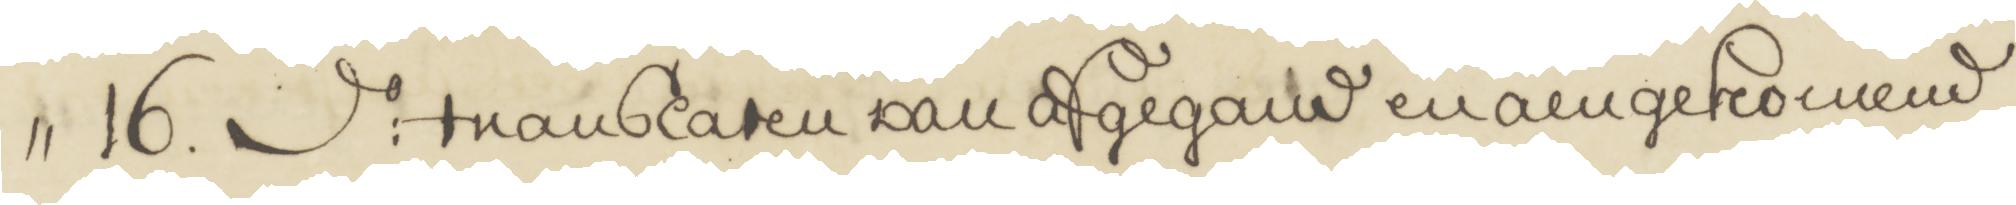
„ 16. D:o translaten van afgegane en aengekomene
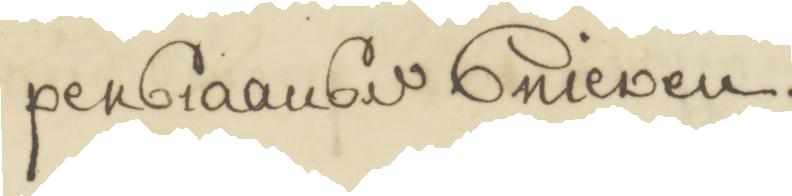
persiaanse brieven
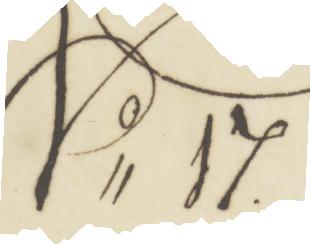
N„o 17.
